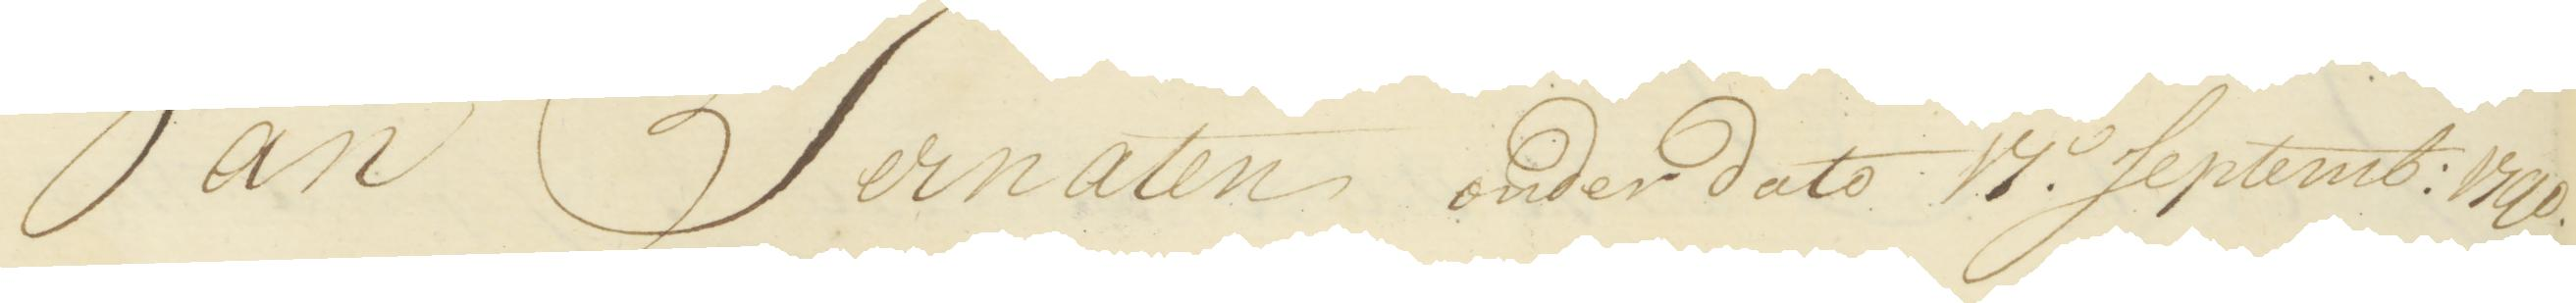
Van Ternaten onder dato 17.' Septemb: 1740
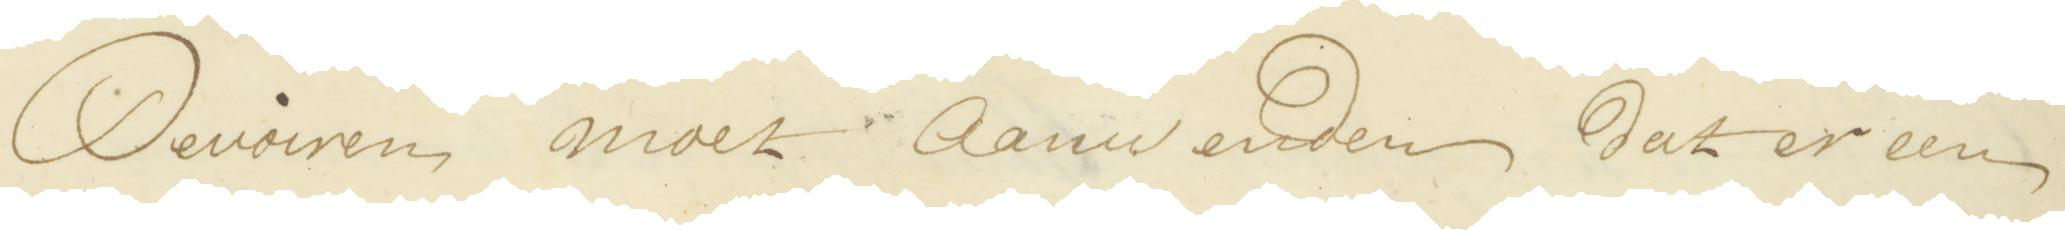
Devoiren moet Aanwenden dat er een
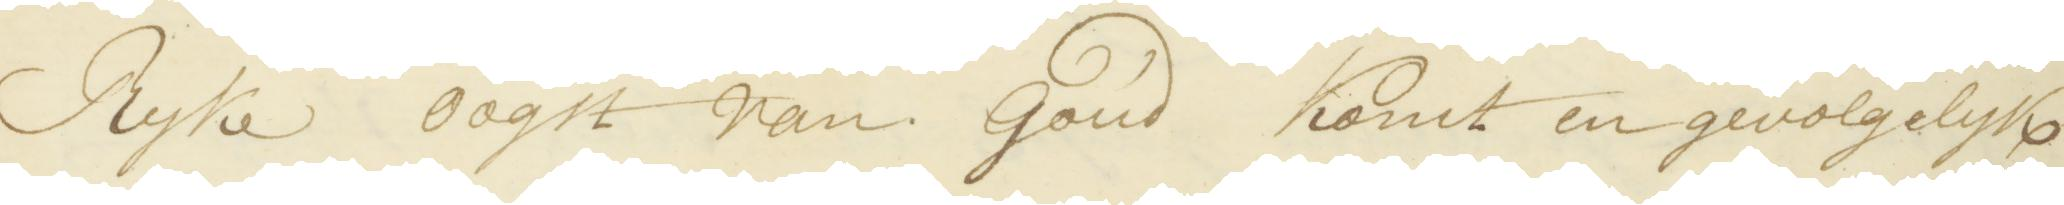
Ryke Oogst van Goud komt en gevolgelyk
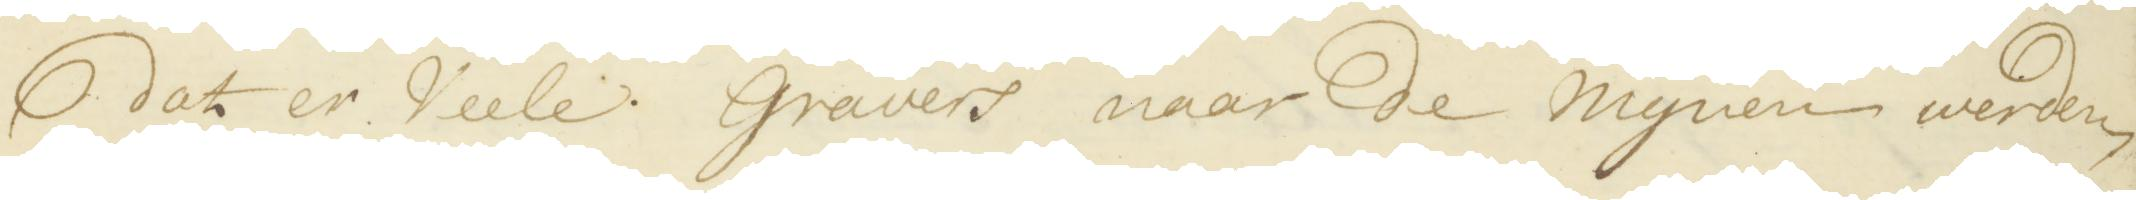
dat er Veele Gravers naar de mynen werden
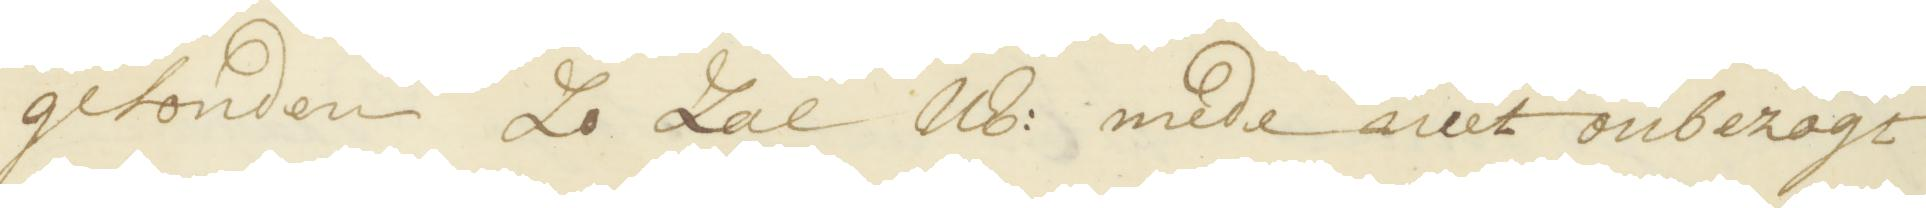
gesonden zo zal UE: mede niet onbezogt
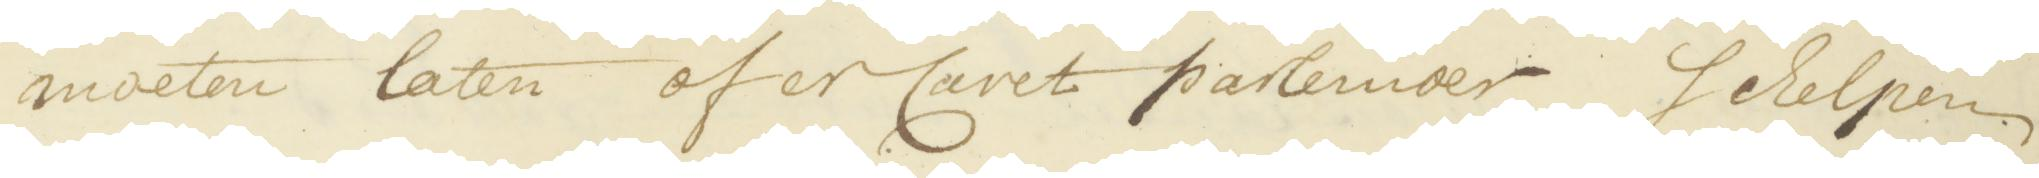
moeten laten of er Caret parlemoer schelpen
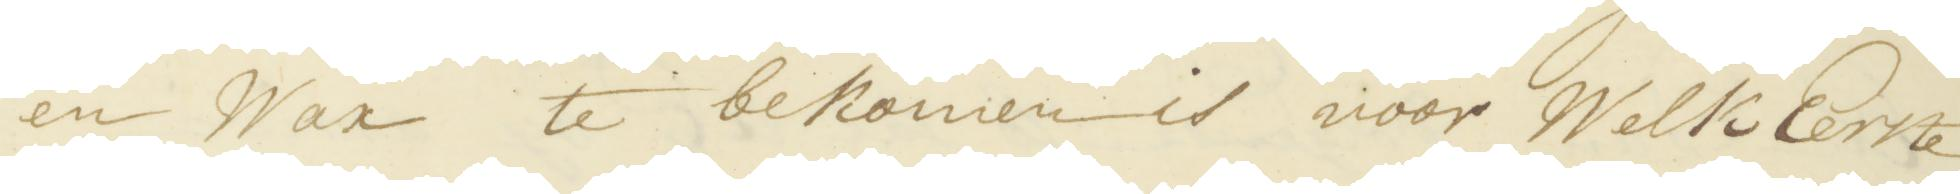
en wax te bekomen is voor welk Eerste
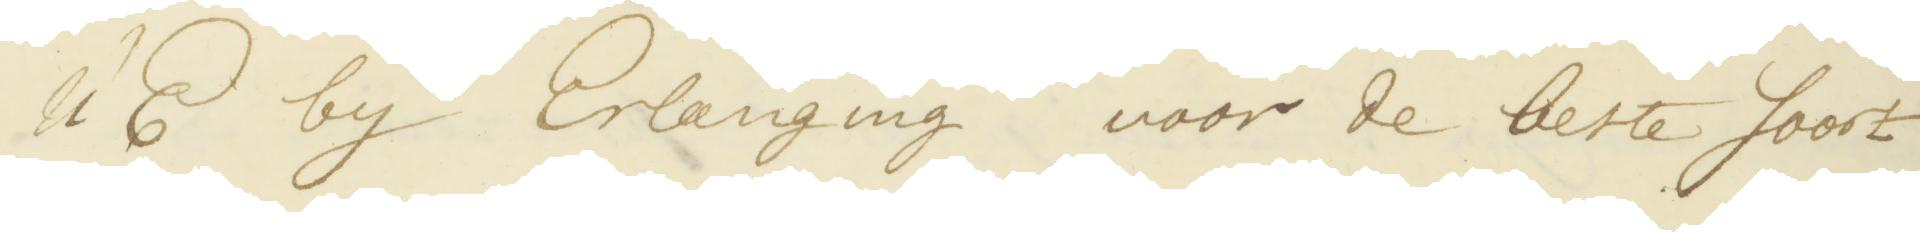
uE bij Erlanging voor de beste soort
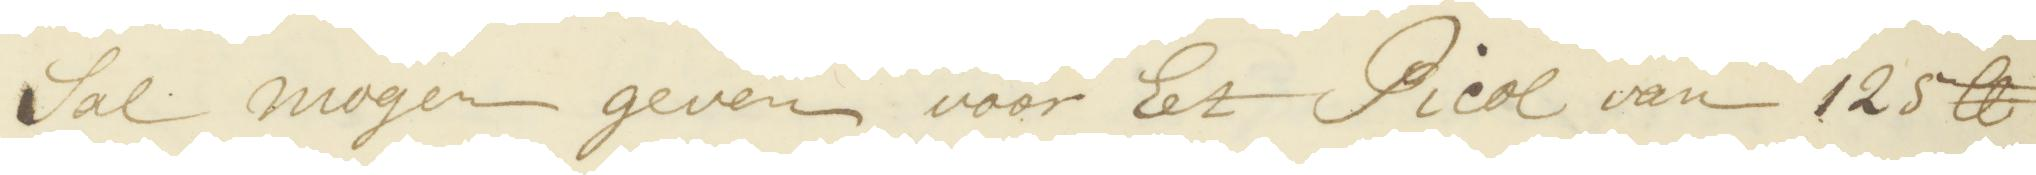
sal mogen geven voor het Picol van 125lb
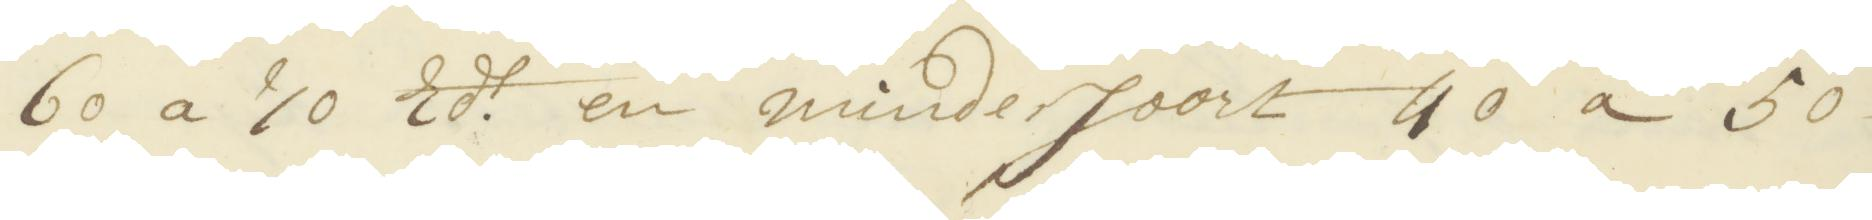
60 a 70 rd.s en mindersoort 40 a 50
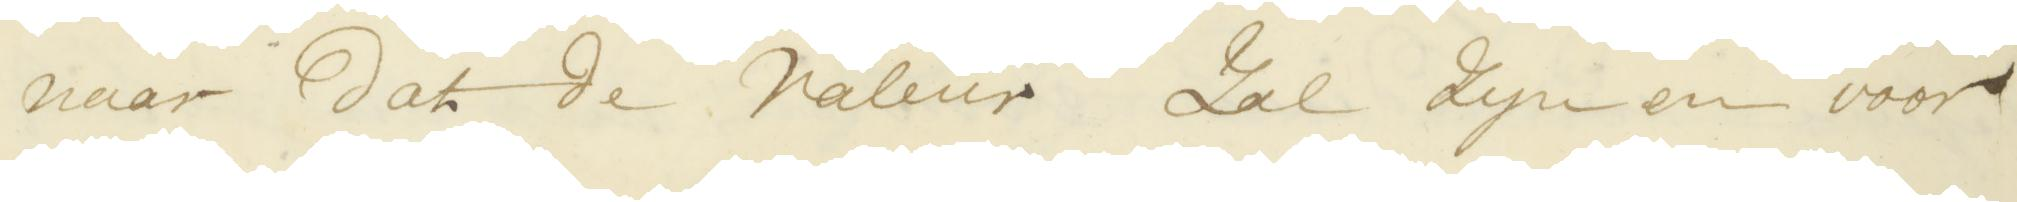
naar dat de valeur zal zyn en voor
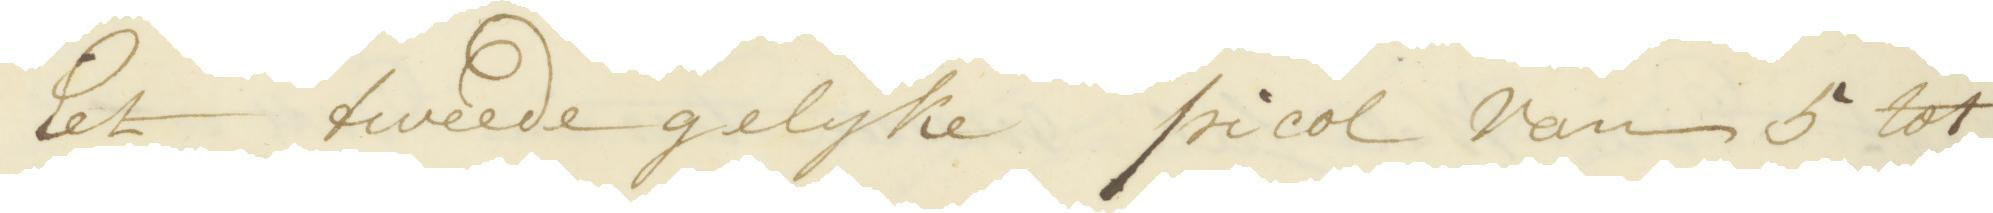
het tweede gelyke picol van 5 tot
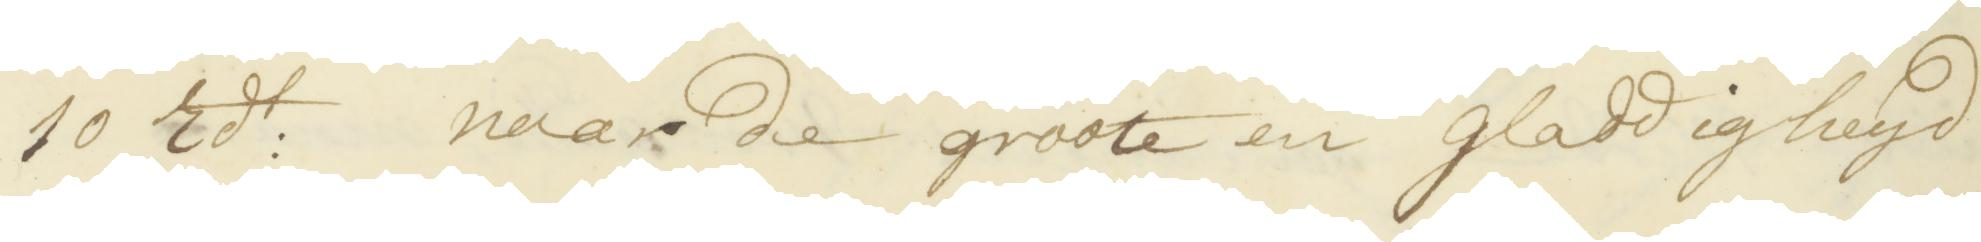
10 rd:s naar de groote en gladdigheijd
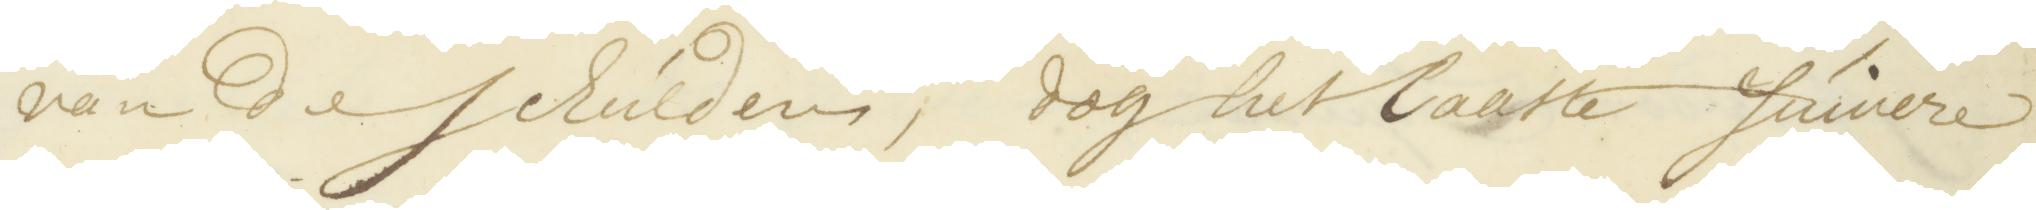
van de schulden; dog het laaste suivere
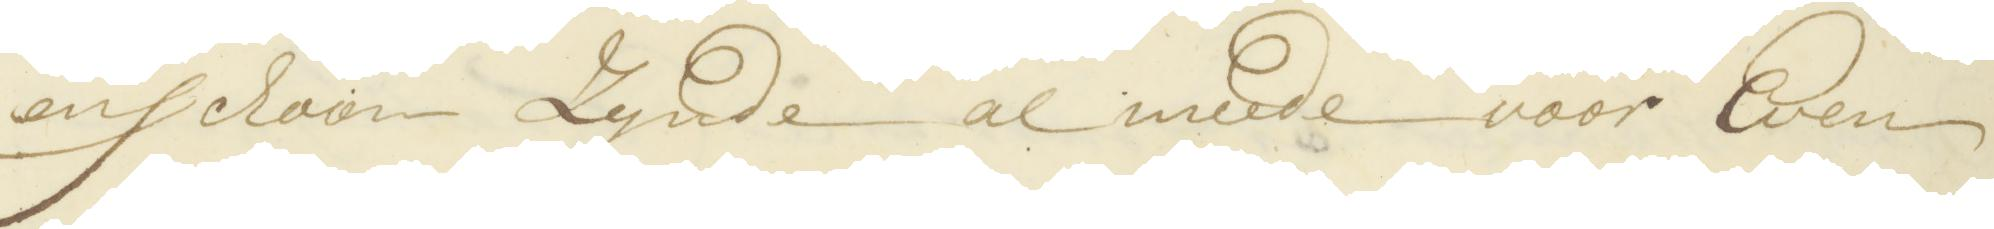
en schoon zynde al meede voor Even
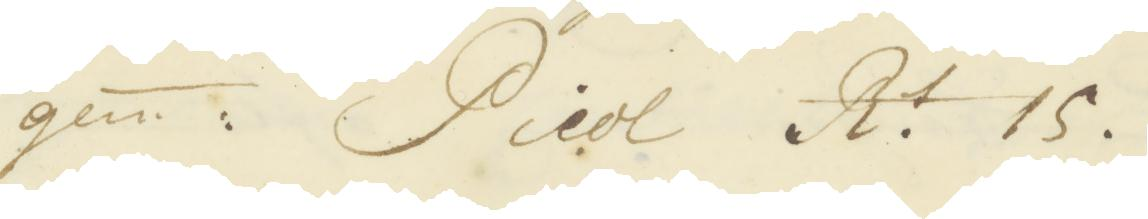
gem: Picol R.s 15.
